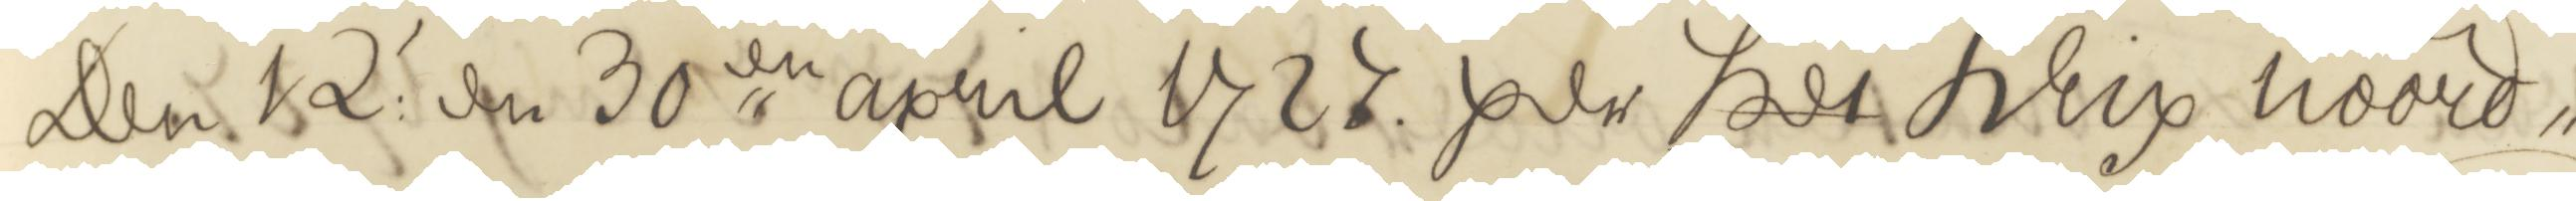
Den 12:' en 30„en april 1727. per het Schip noord„
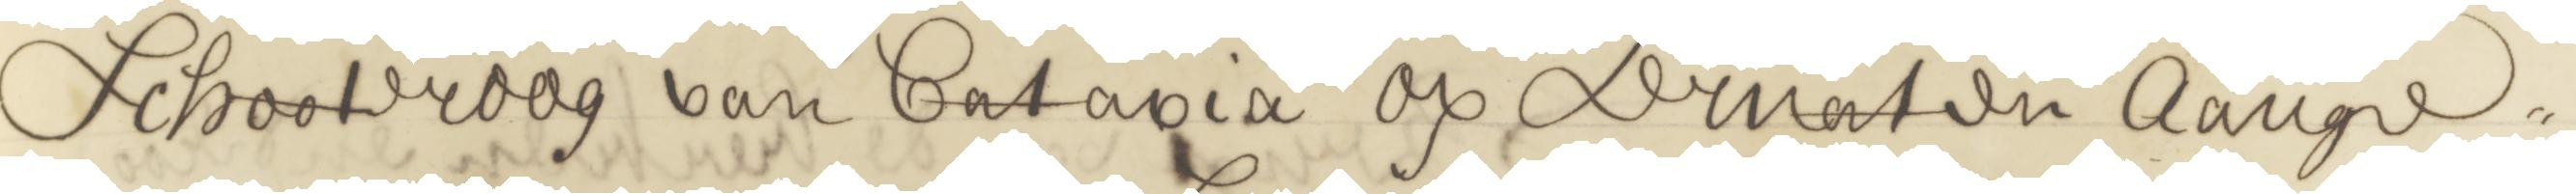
Schooteroog van batavia op Ternaten Aange„
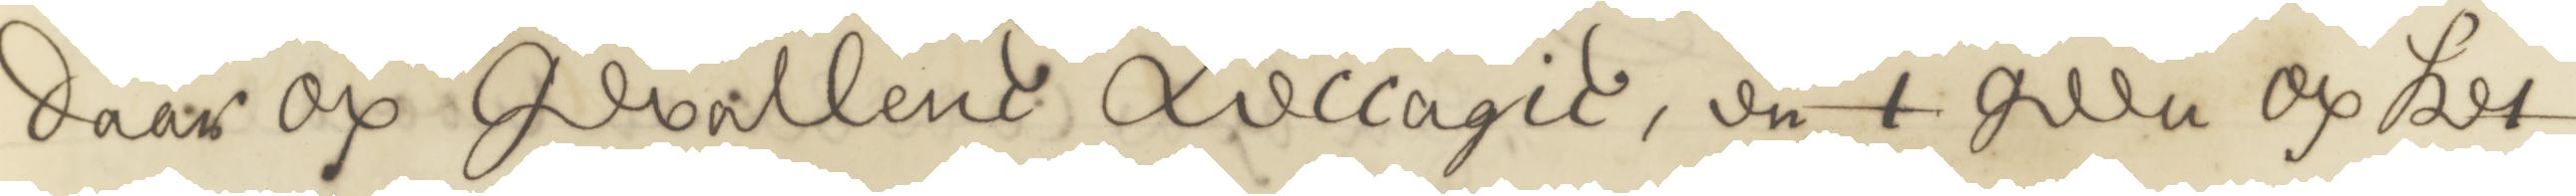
daar op gevallene Leccagie, en ’t geen op het
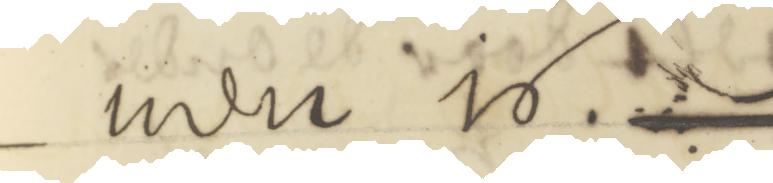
nen is.
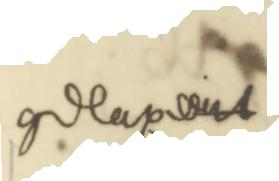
gelapeert
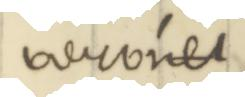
vervult.
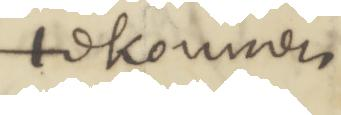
te konnen
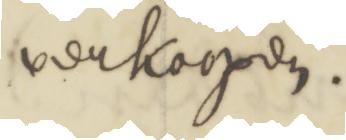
verkoopen.
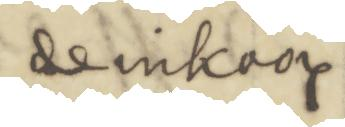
de inkoop
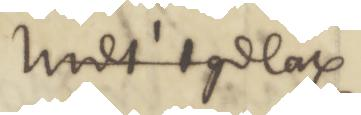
met 't gelax
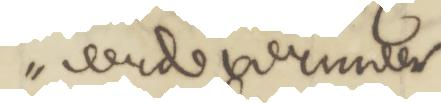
„ eerde vermeer
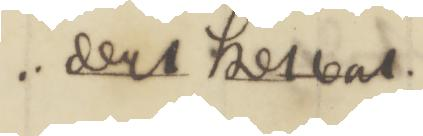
„dert het vat.
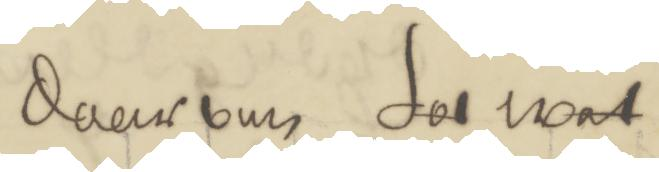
daar van tot wat
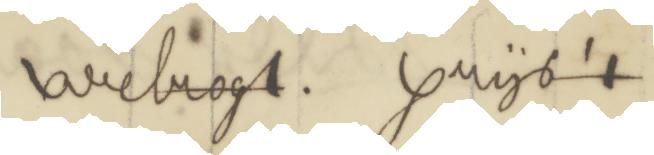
verkogt. prijs 't
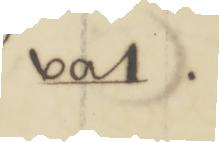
vat.
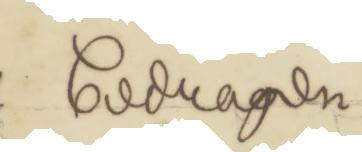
bedragen
